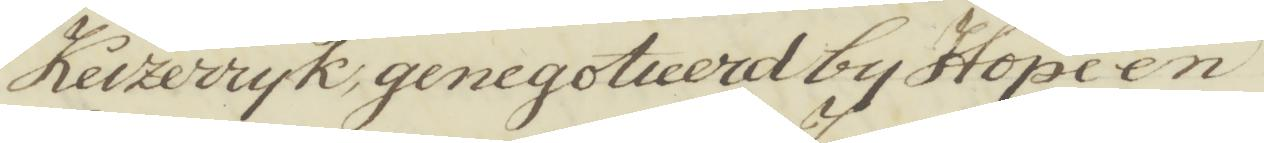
Keizerryk, genegotieerd by Hope en
